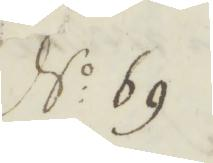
N:o 69
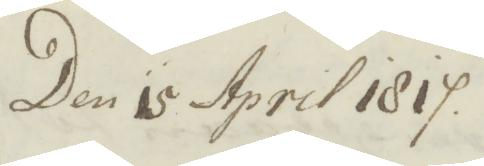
Den 15 April 1817.
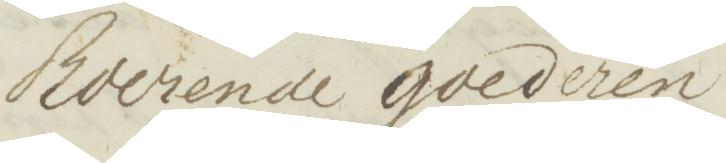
Roerende goederen
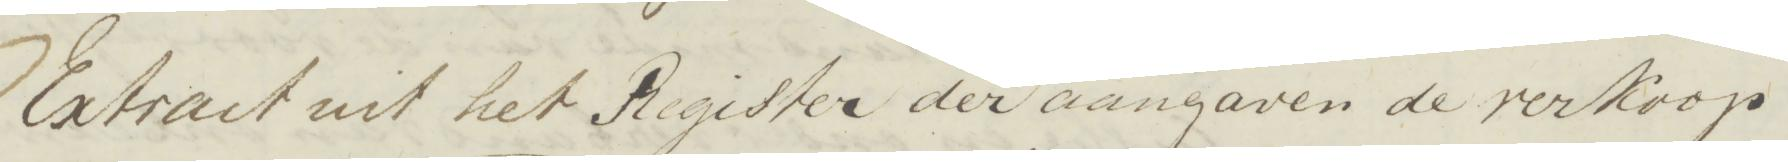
Extract uit het Register der aangaven de verkoop
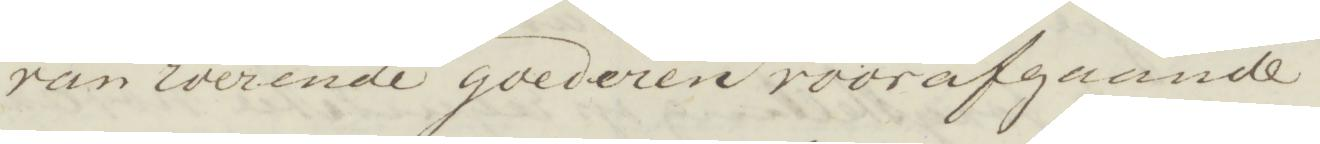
van roerende goederen voorafgaande
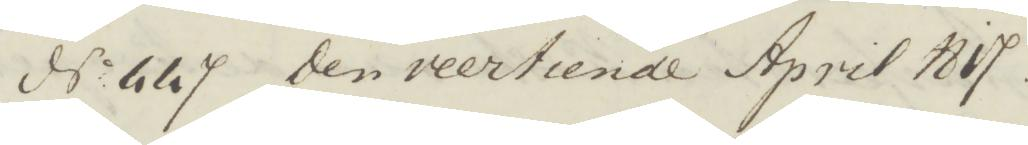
N:o 447 den veertiende April 1817.
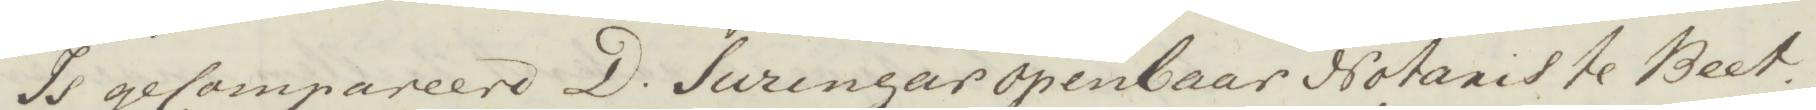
Is gecompareerd D. Suringar openbaar Notaris te Beet.
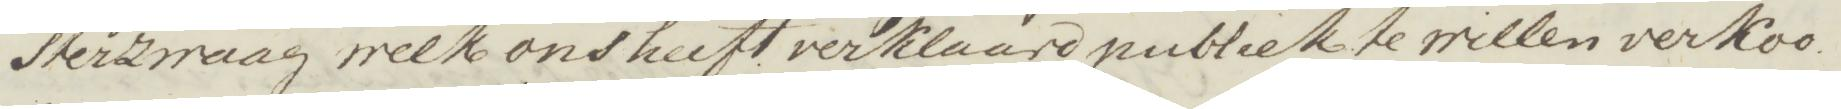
sterzwaag welk ons heeft verklaard publiek te willen verkoo.
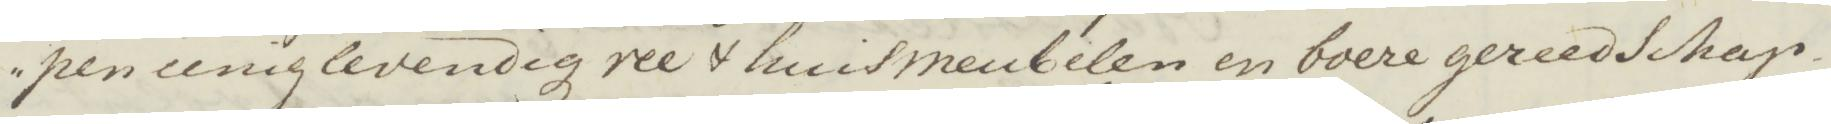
„pen eenig levendig vee & huismeubelen en boere gereedschap.
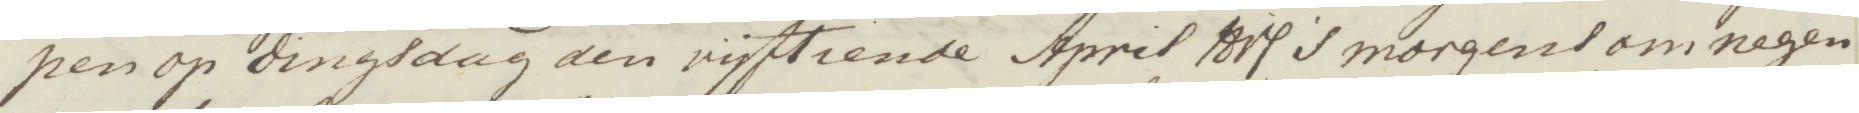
pen op dingsdag den vijftiende April 1817 's morgens om negen
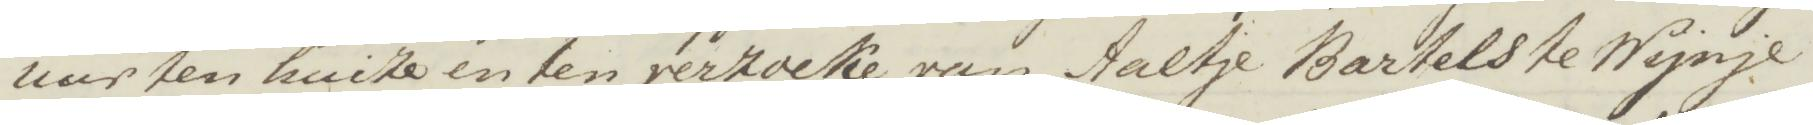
uur ten huize en ten verzoeke van Aaltje Bartels te Wijnje
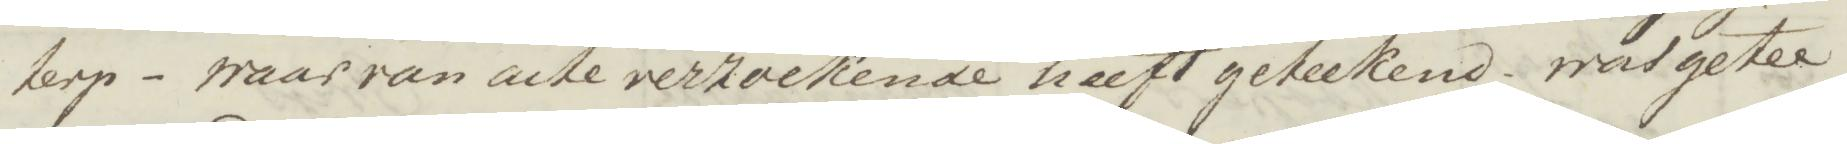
terp - waar van acte verzoekende heeft geteekend - was getee
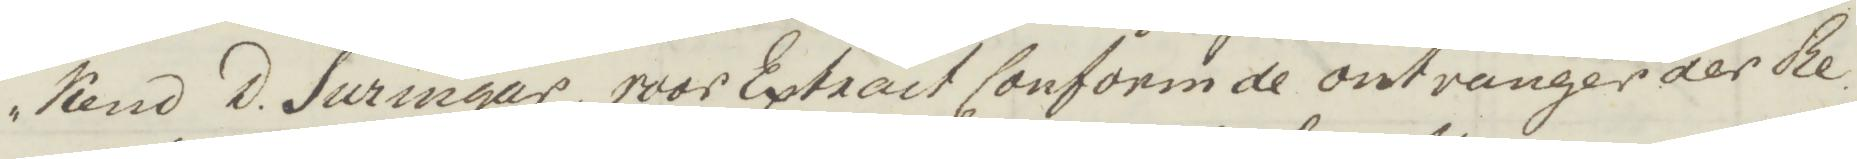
„kend D. Suringar, voor Extract Conform de ontvanger der Re„
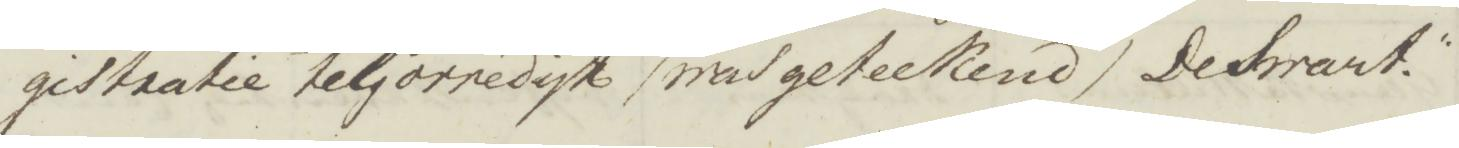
gistratie teGorredijk /was geteekend/ DeSwart."
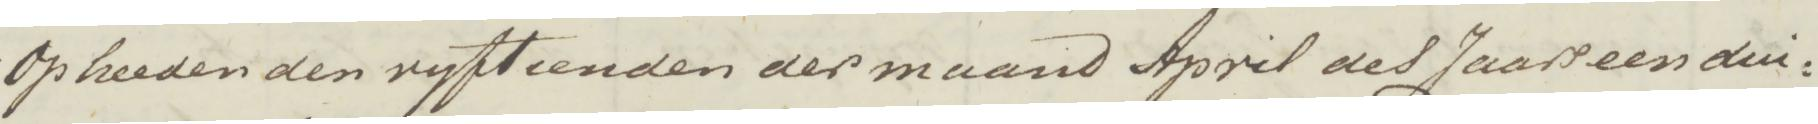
Op heeden den vyftienden des maand April des Jaars een dui„
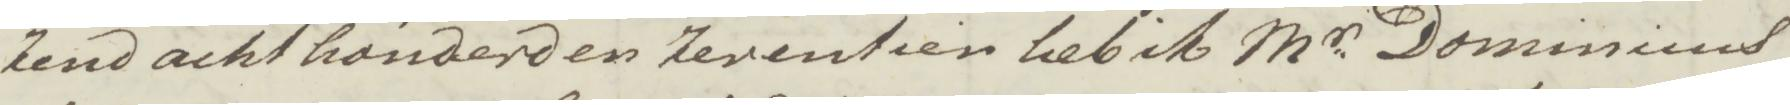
zend acht honderd en zeventien heb ik M:r Dominicus
